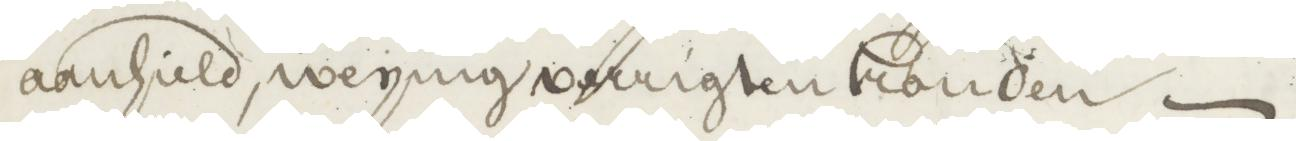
aanhield, weijnig verrigten konden —
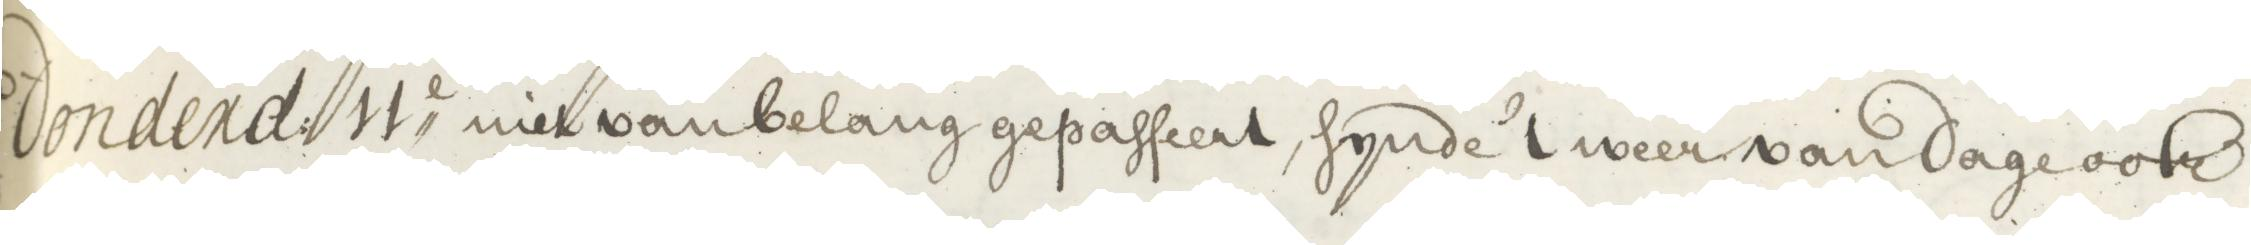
donderd: 11„' niet van belang gepasseert, synde ’t weer van dage ook
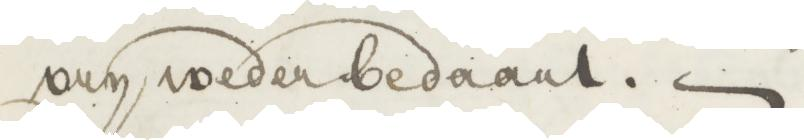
vry weder bedaart. —
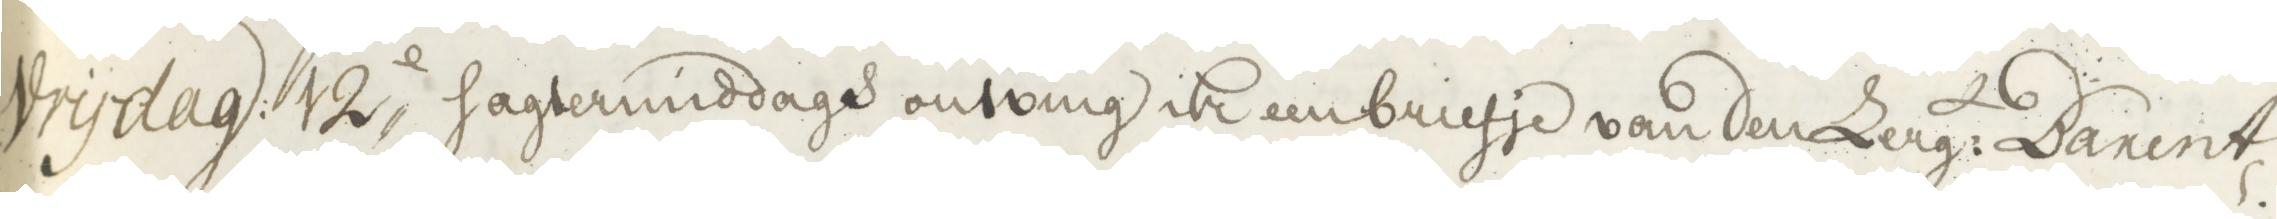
Vrijdag: 12„' sagtermiddags ontving ik een briefje van den zerg:t Barent
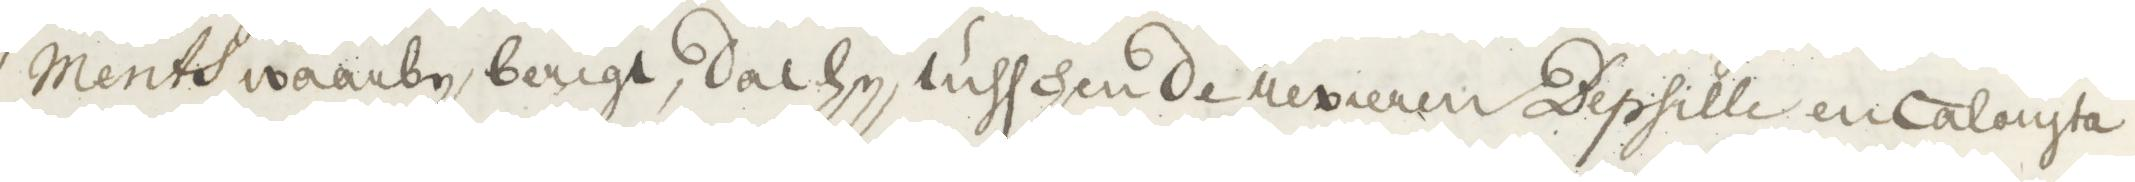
Ments waarby berigt, dat hy tusschen de revieren Bepsille en Caloujta
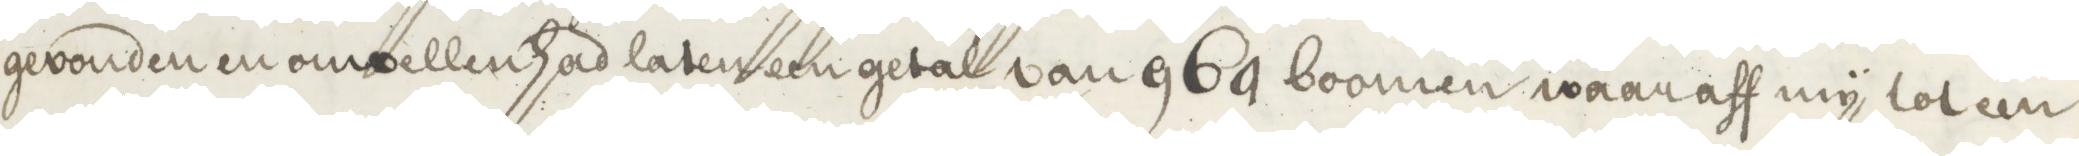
gevonden en omvellen had laten een getal van 964 boomen waar aff mij tot een
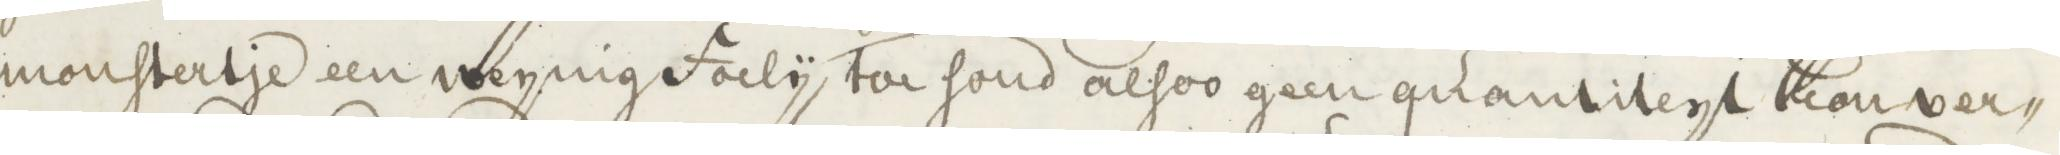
monstertje een weynig Foelij toe sond alsoo geen quantiteijt kon ver„
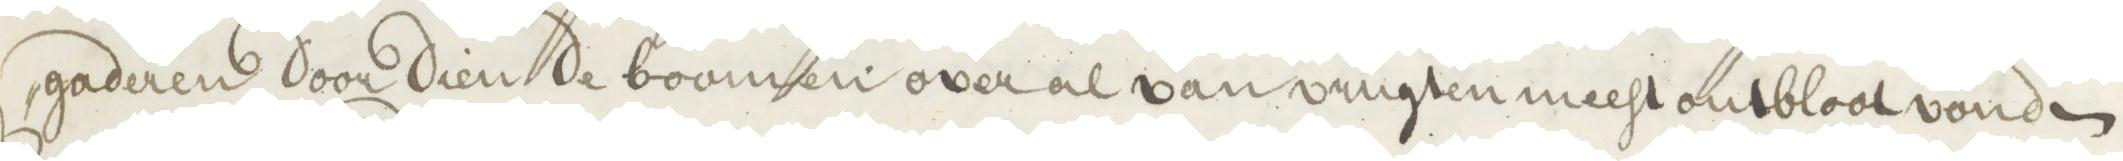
„gaderen, door dien de boomen over al van vrugten meest ontbloot vonden
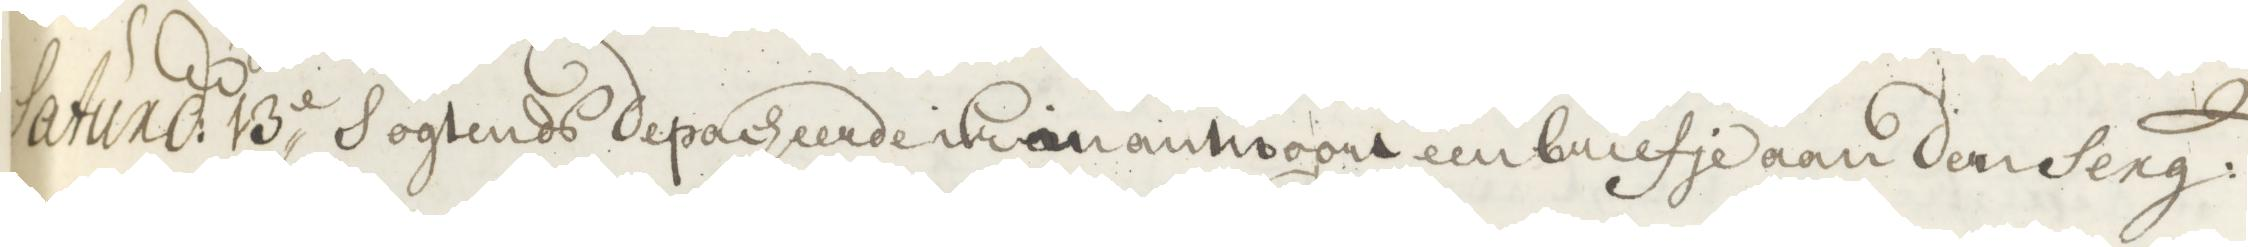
Saturd: 13„e sogtends depacheerde ik in antwoort een briefje aan den serg:t
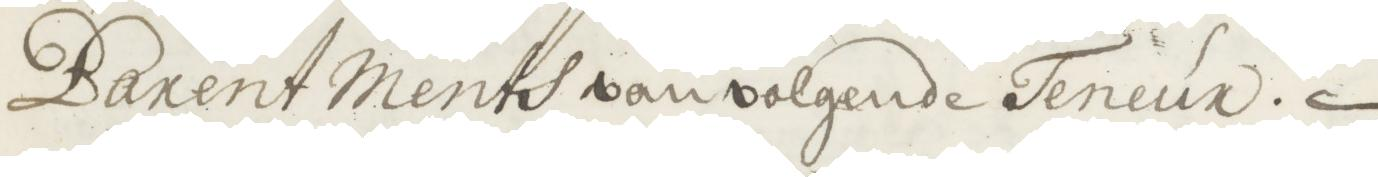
Barent Ments van volgende Teneur. —
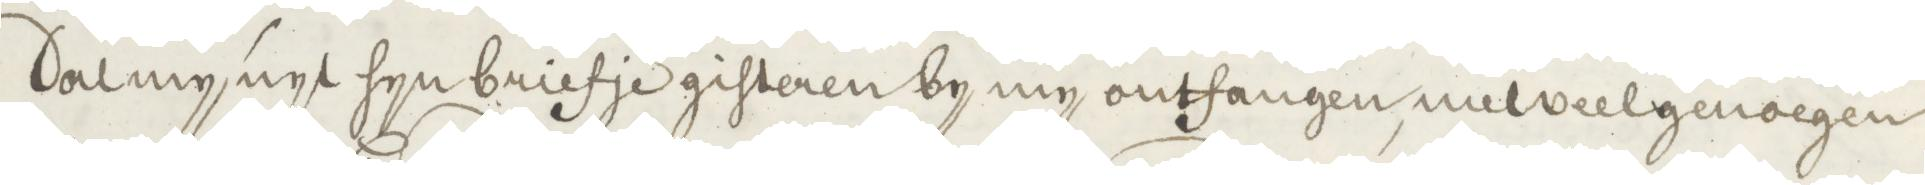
dat my uyt syn briefje gisteren by my ontfangen, met veel genoegen
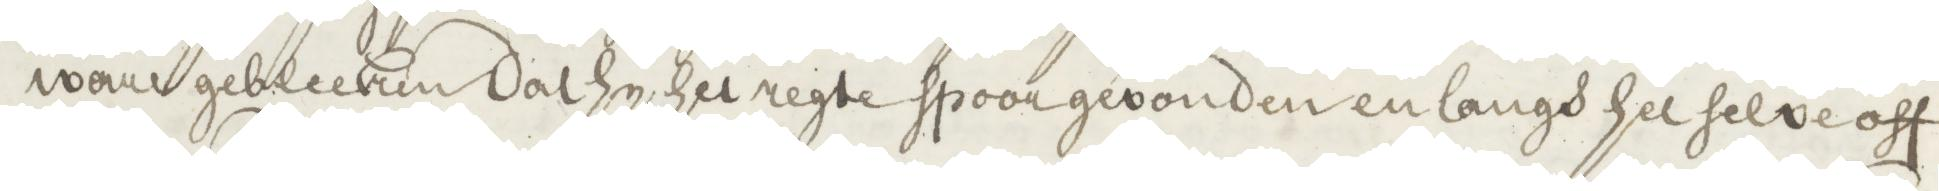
ware gebleeken dat hy het regte spoor gevonden en langs het selve off
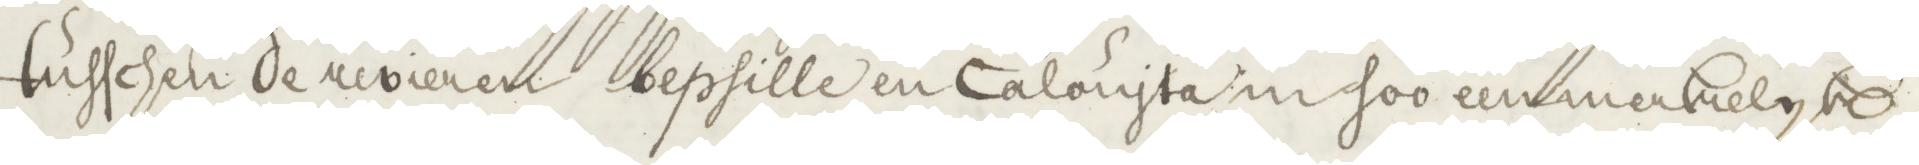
tusschen de revieren bepsille en Caloujta in soo een merkelyk
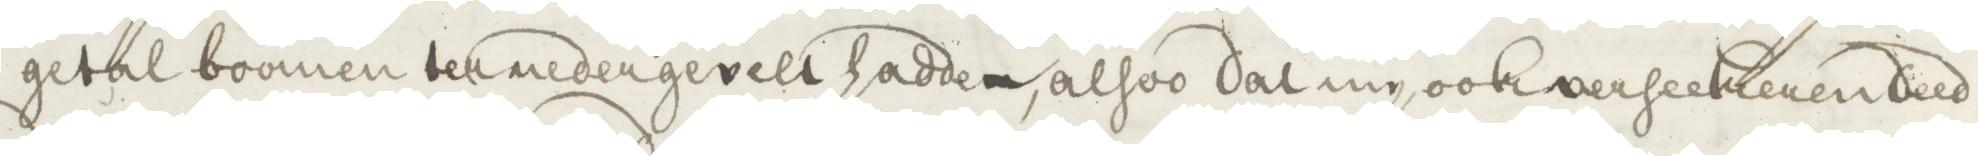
getal boomen ter nedergevelt hadde, alsoo dat my ook verseekeren deed
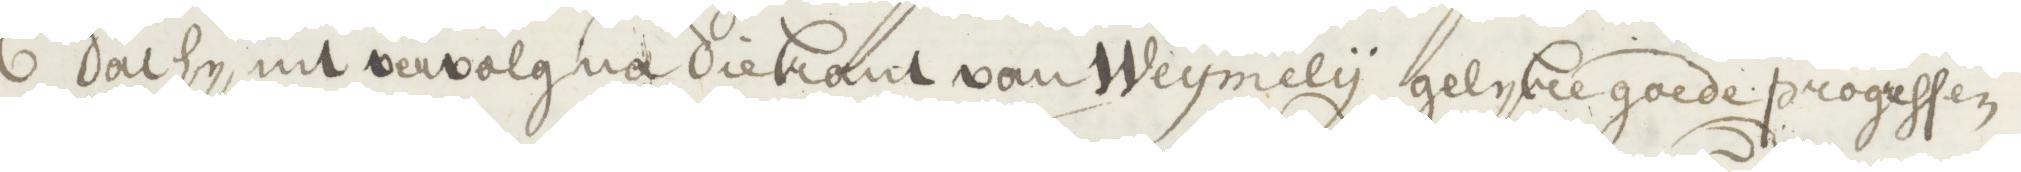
dat hy in't vervolg na die kant van Weymelij gelyke goede progressen
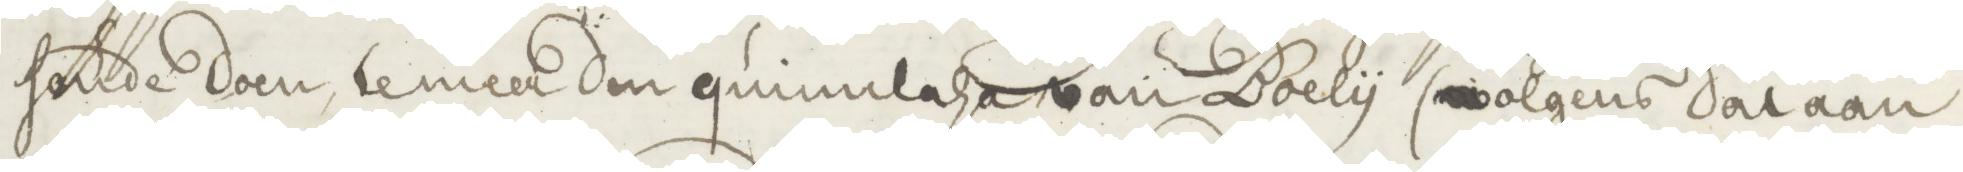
soude doen, te meer den quimilaha van Boelij (volgens dat aan
